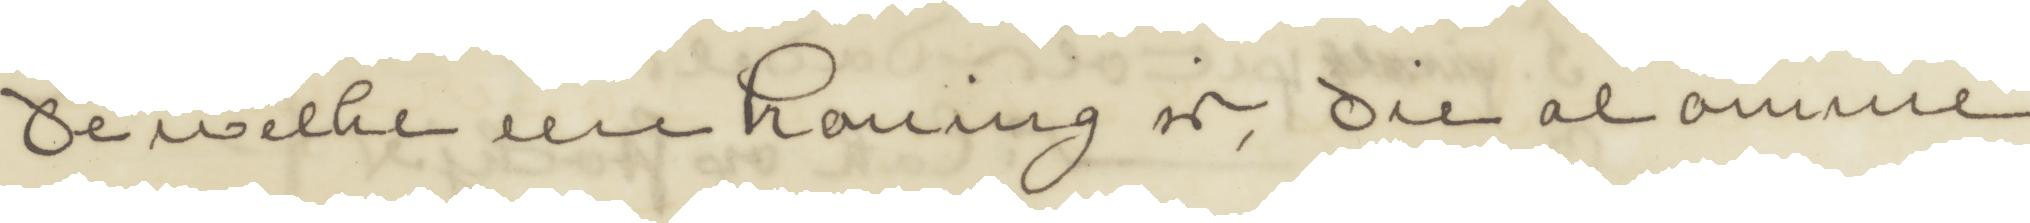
de welke een koning is, die al omme
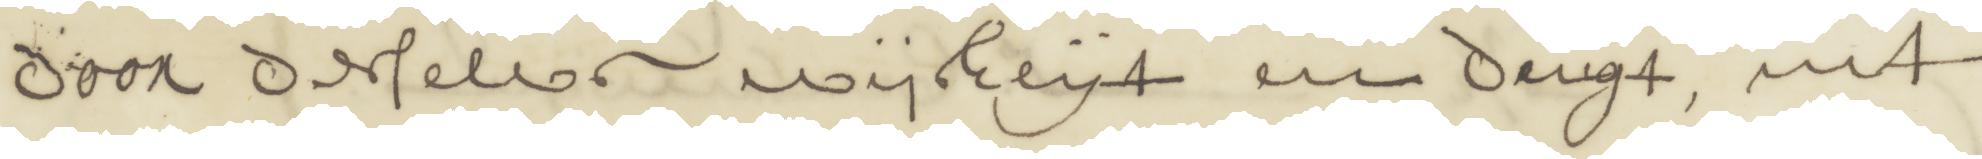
door desselvs wijsheijt en deugt, in’t
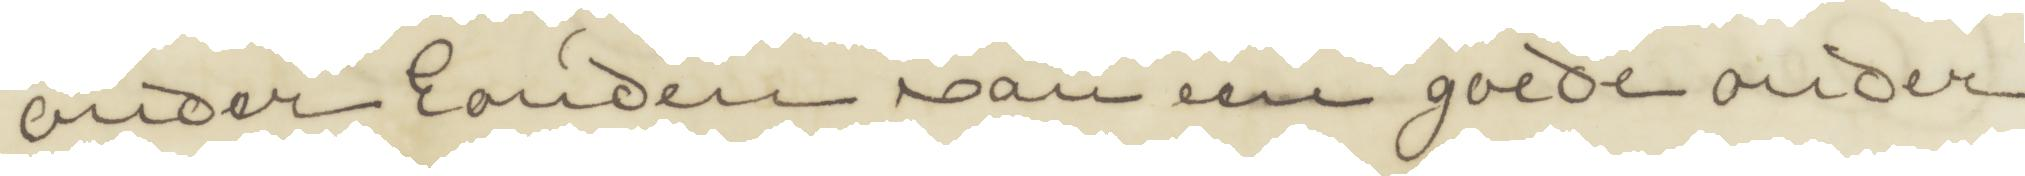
onder houden van een goede onder
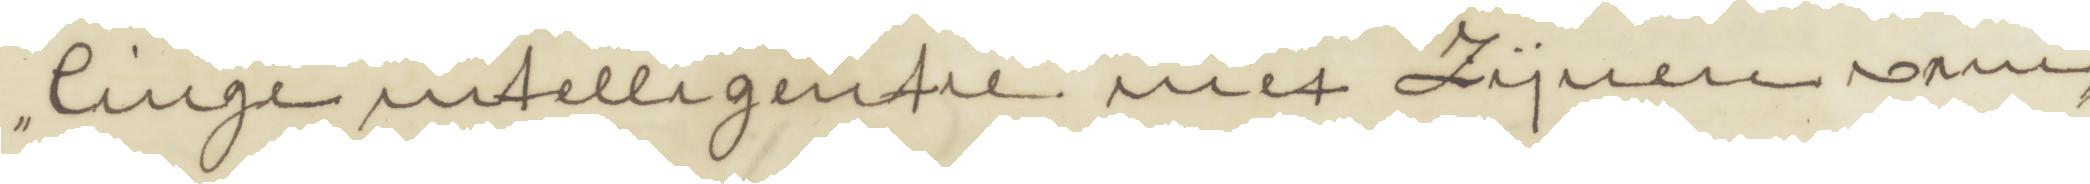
„linge intelligentie met zijnen vrin„
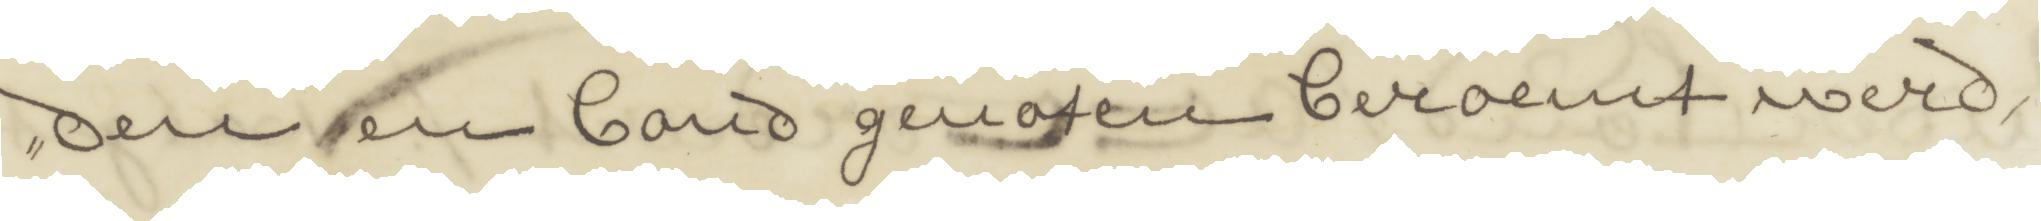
„den en bond genoten beroemt werd,
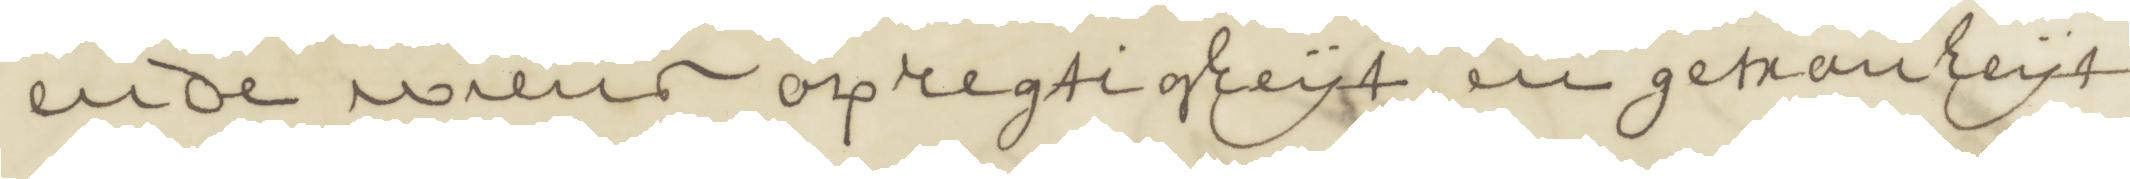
en de wiens opregtigheijt en getrouheijt
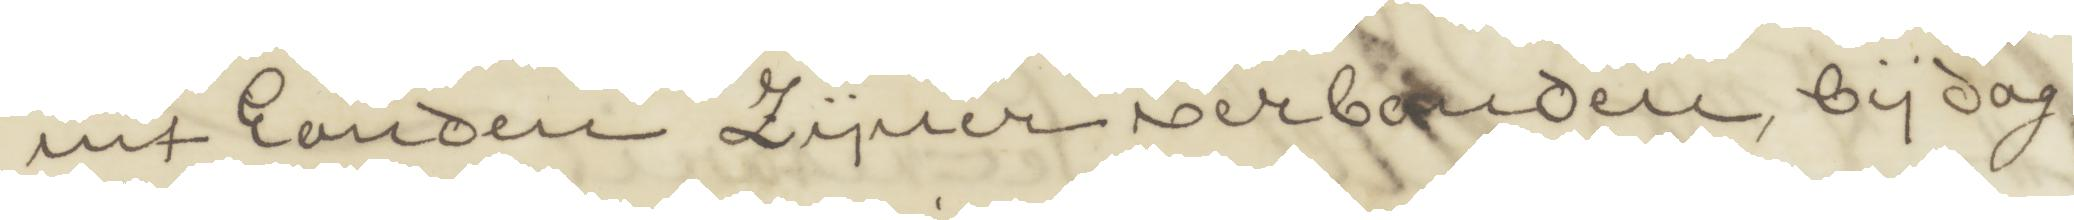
in't houden zijner verbonden, bij dag
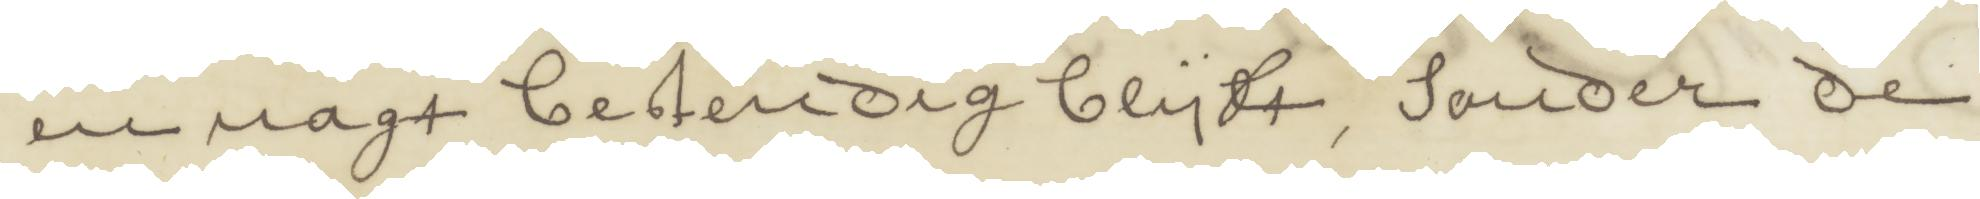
en nagt bestendig blijft, sonder de
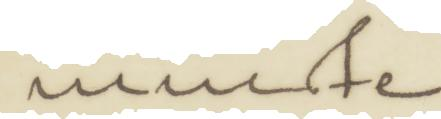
minste
